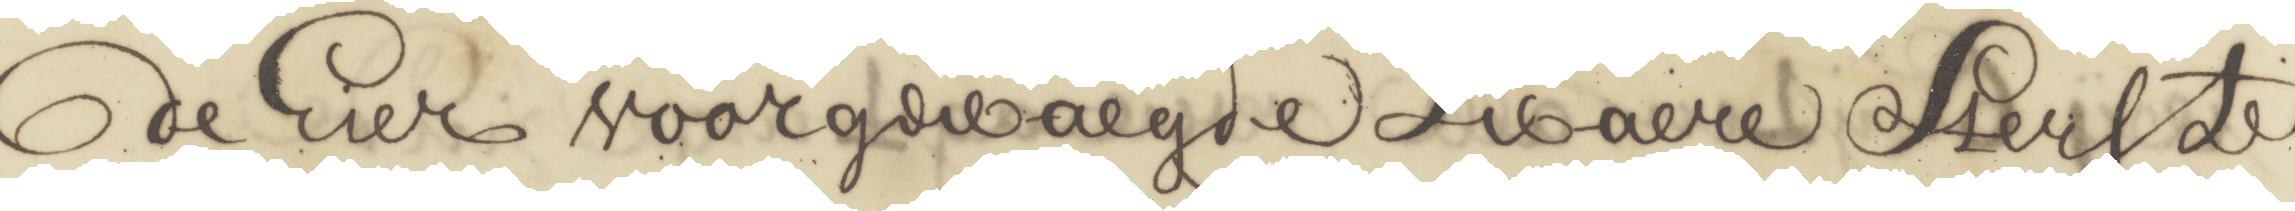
de hier voorgewaegde swaere sterfte
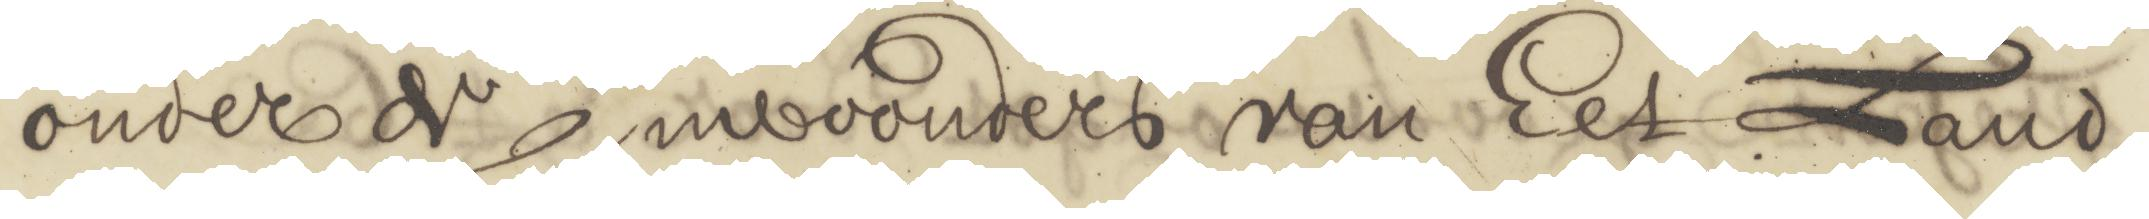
onder d=o ijnwoonders van het Land,
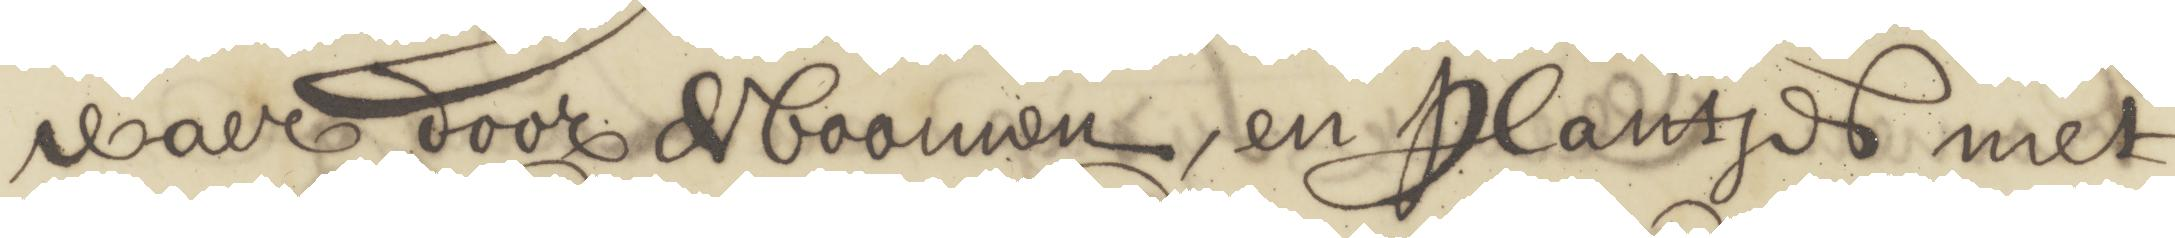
waer door de boomen, en plantjes niet
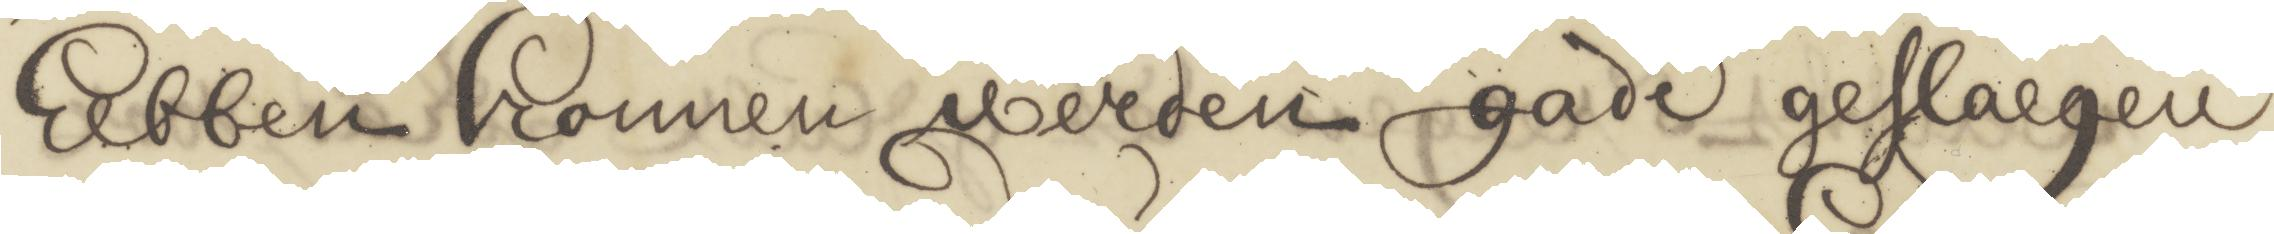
hebben konnen werden gade geslaegen,
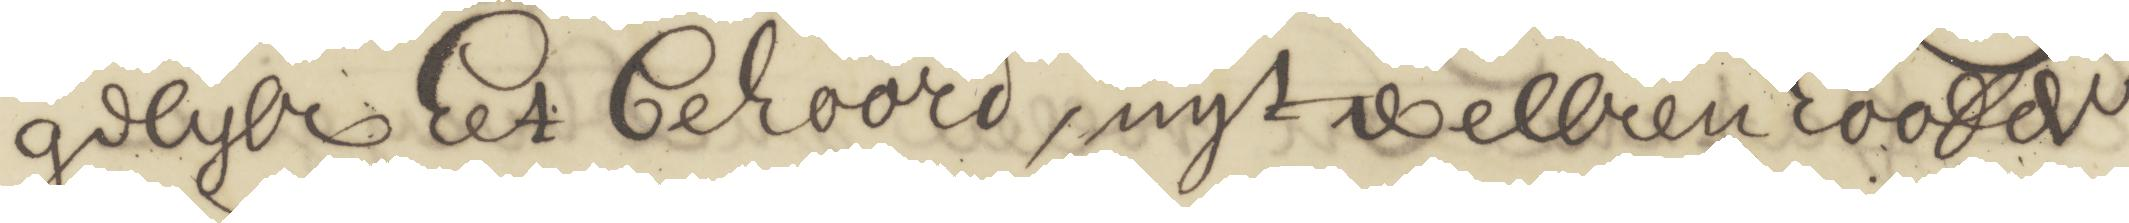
gelijk het behoord, uijt welken hoofde
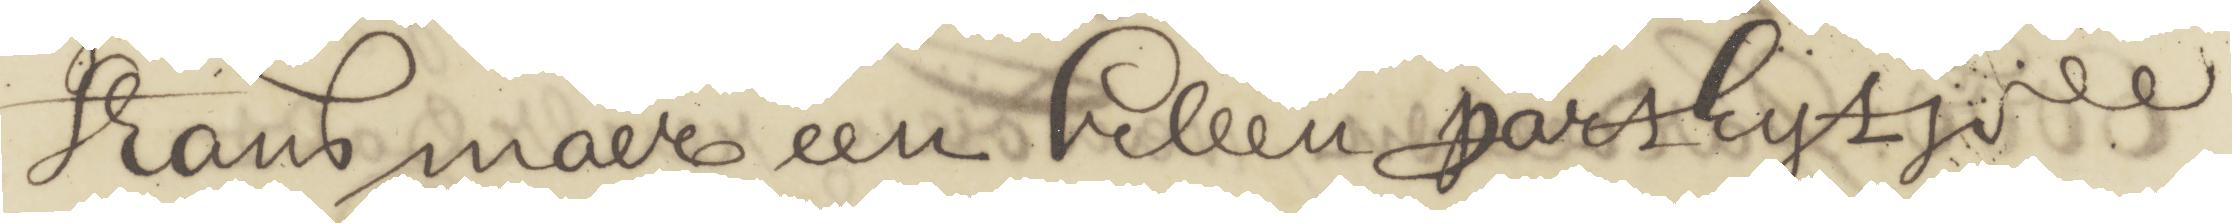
thans maer een kleen parthijtje
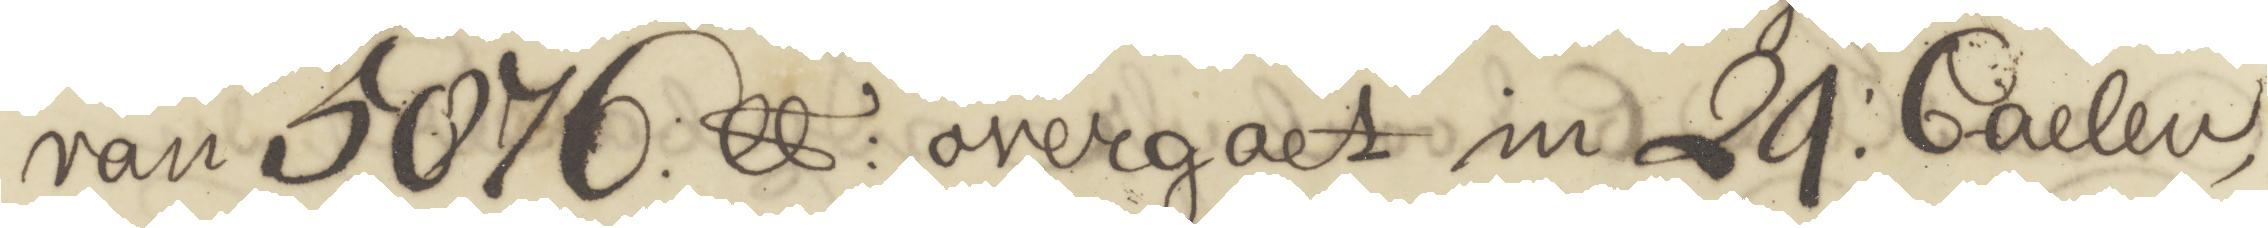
van 5876: lb: overgaet in 24: baelen,
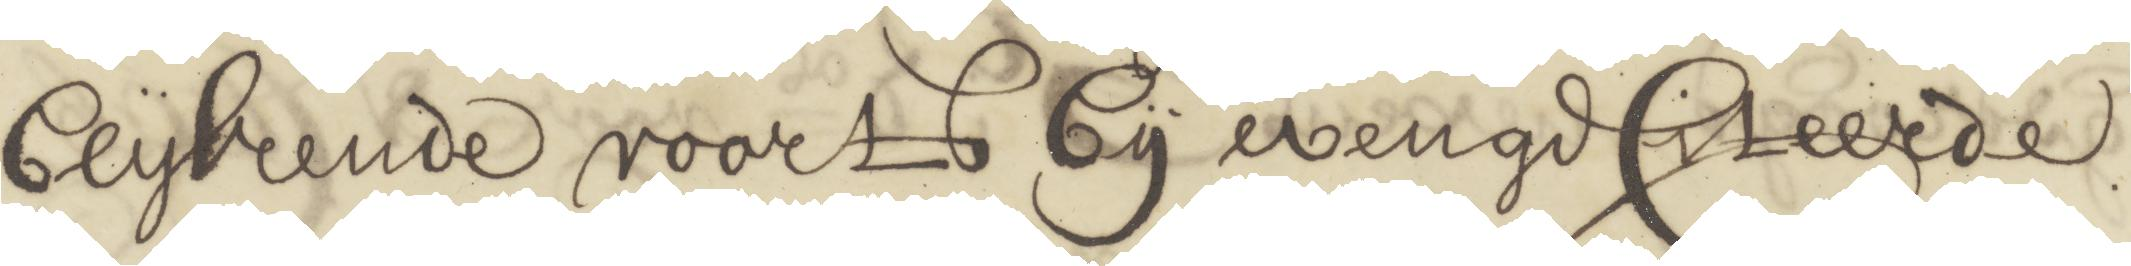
blijkende voorts bij evengeCiteerde.
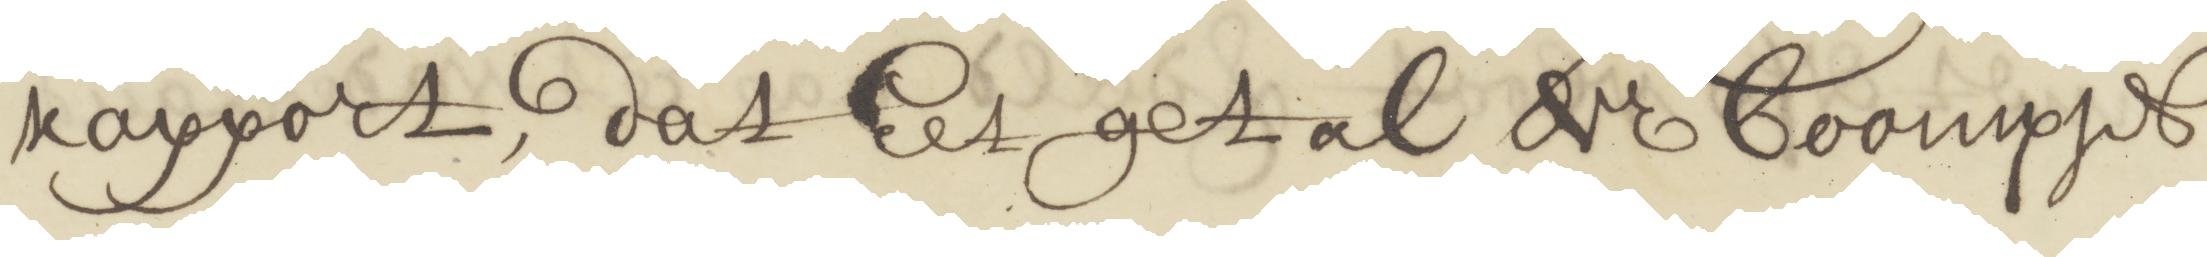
rapport, dat het getal der boompjes
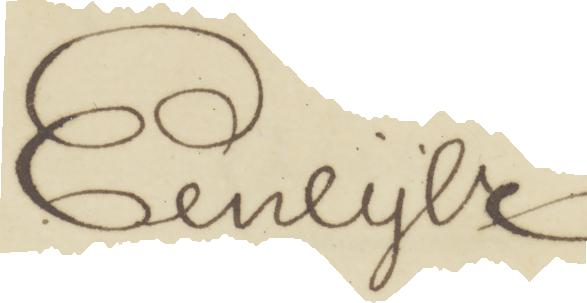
Eenlijk
